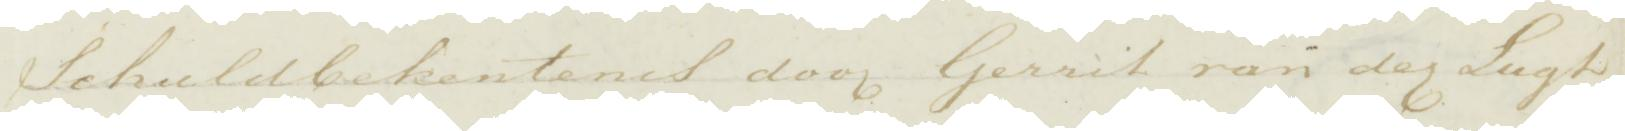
schuldbekentenis door Gerrit van der Lugt
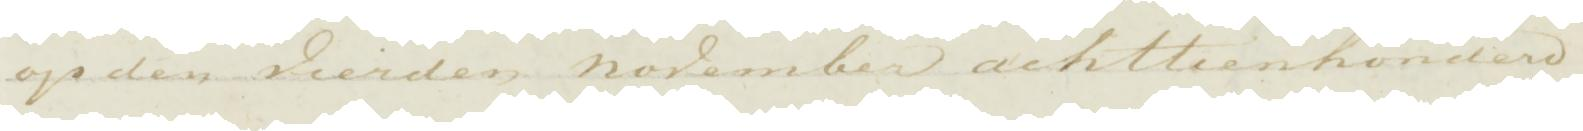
op den vierden november achttienhonderd
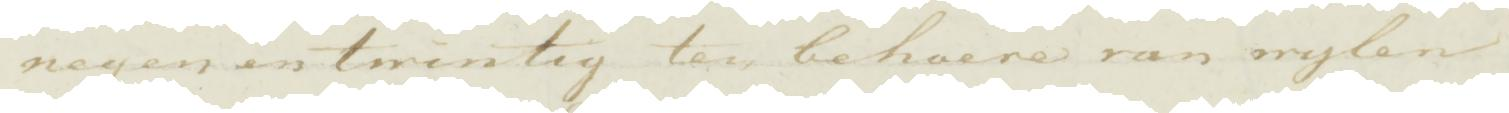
negen en twintig ten behoeve van wylen
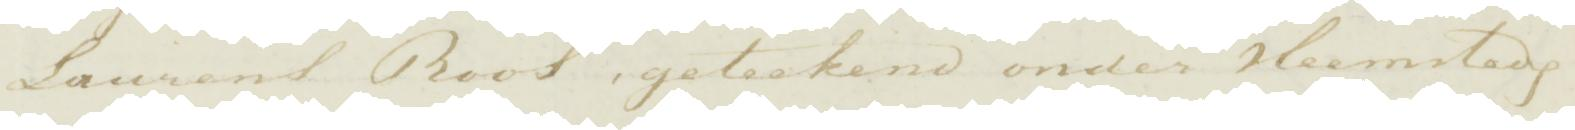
Laurens Roos, geteekend onder Heemstede
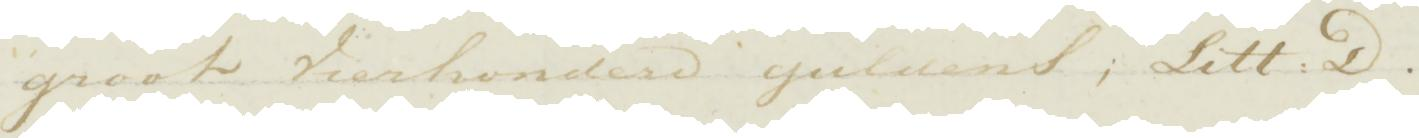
groot Vierhonderd guldens; Litt: D.
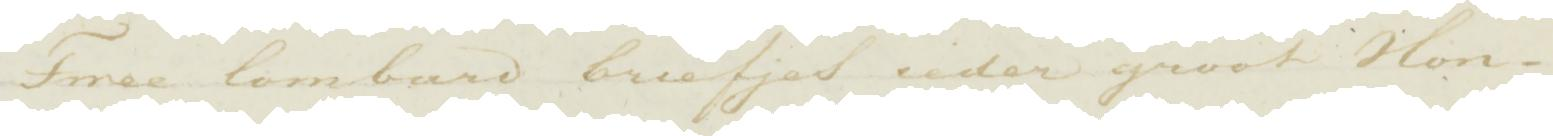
Twee lombard briefjes ieder groot Hon-
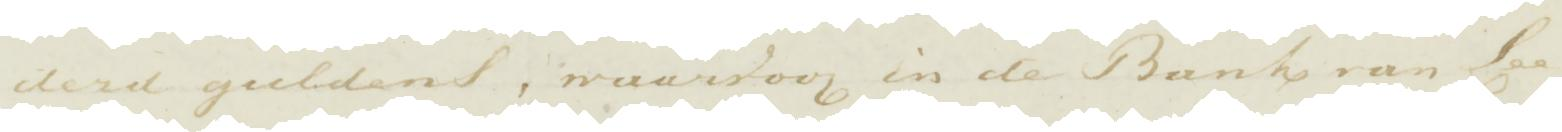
derd guldens, waarvoor in de Bank van Lee
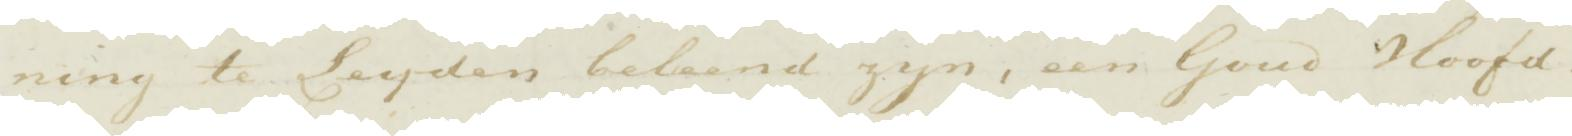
ning te Leijden beleend zyn, een Goud Hoofd
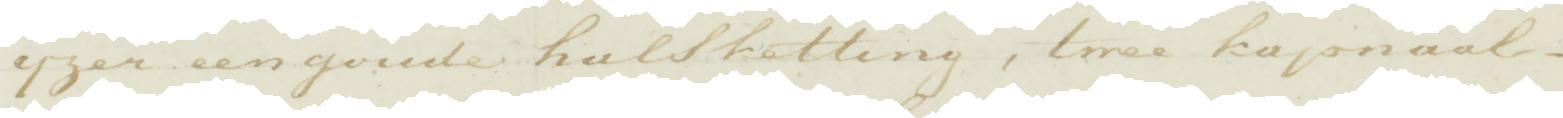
yzer. een goude halsketting, twee kapnaal-
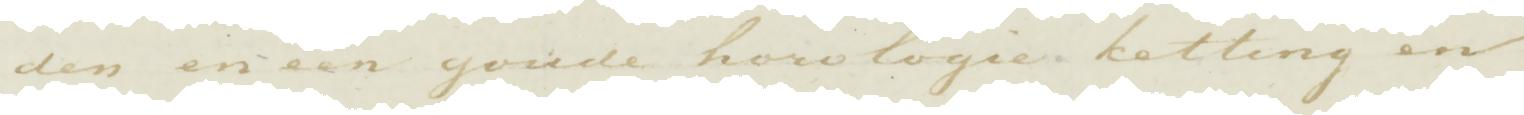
den en een goude horologie ketting en
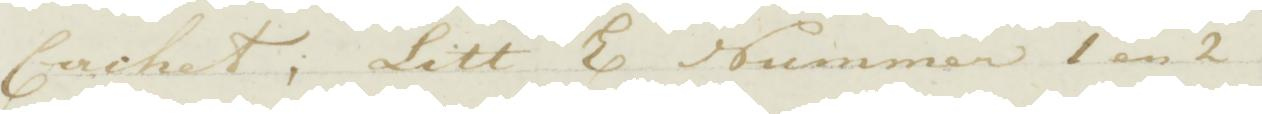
Cachet; Litt E Nummer 1 en 2
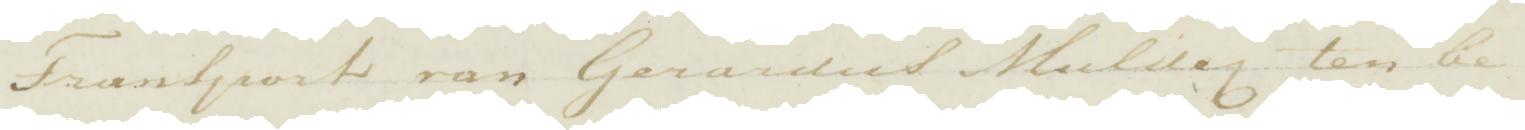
Transport van Gerardus Mulder ten be
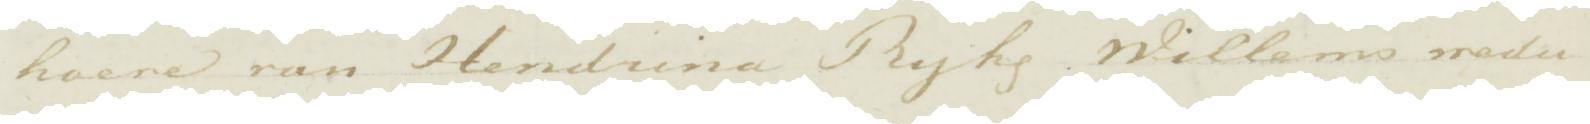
hoeve van Hendrina Ryke Willems wedu
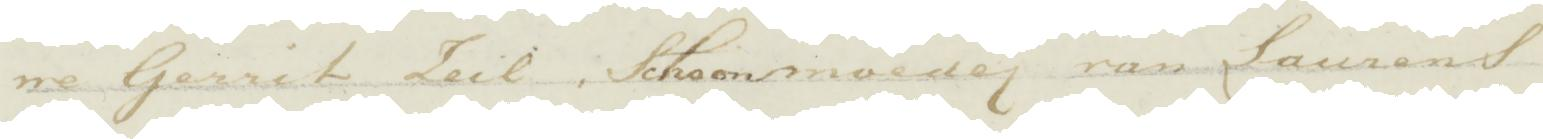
we Gerrit Zeil, schoonmoeder van Laurens
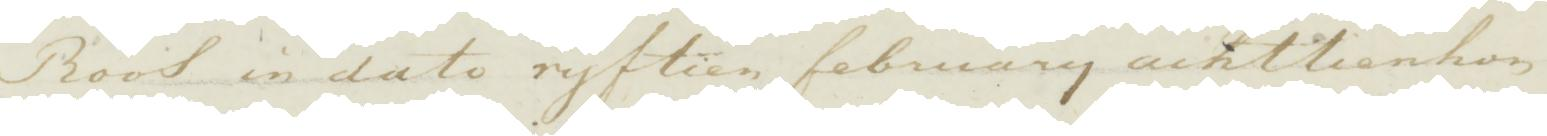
Roos in dato vyftien february achttienhon
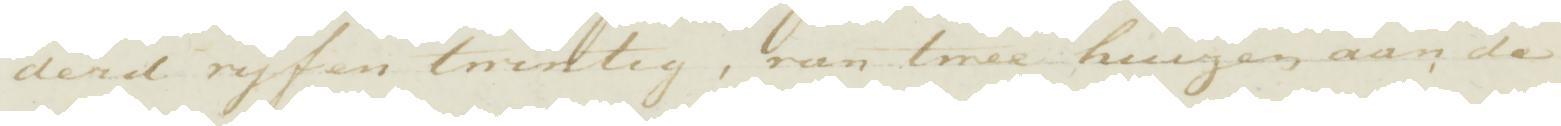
derd vyfen twintig, van twee huizen aan de
